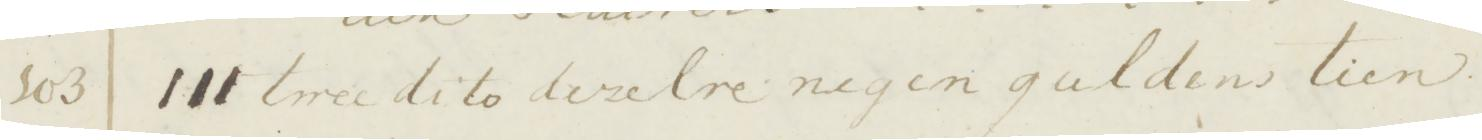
103 111 twee dito dezelve negen guldens tien.
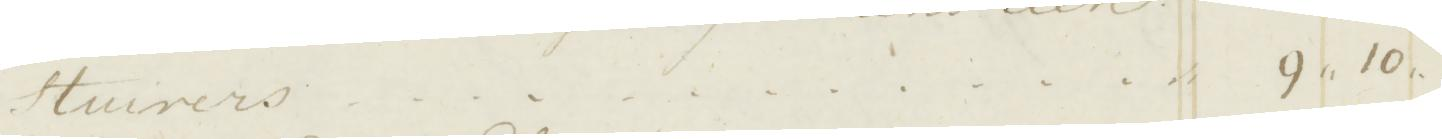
stuivers . . . . . . . . . . . . . „ 9„ 10„
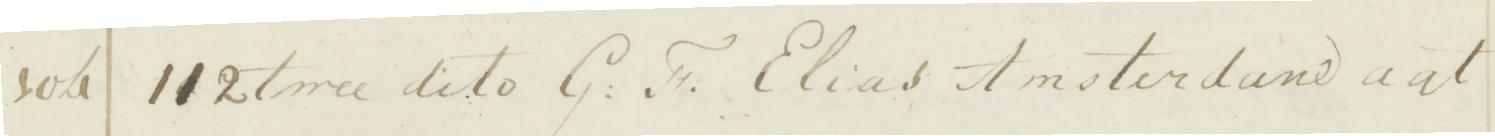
104 112 twee dito G: F: Elias Amsterdam agt
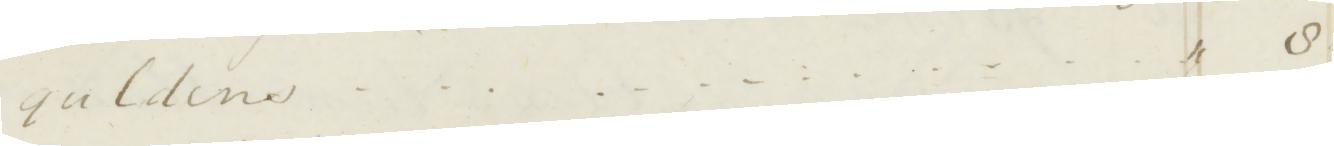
guldens. . . . . . . : . . . . . . „ 8
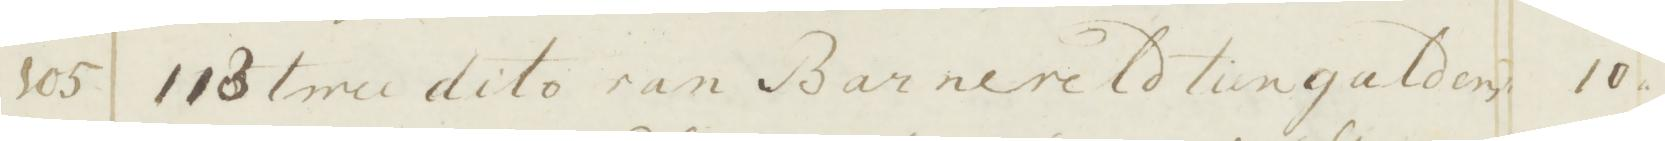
105 113 twee dito van Barneveld tien gulden „ 10„
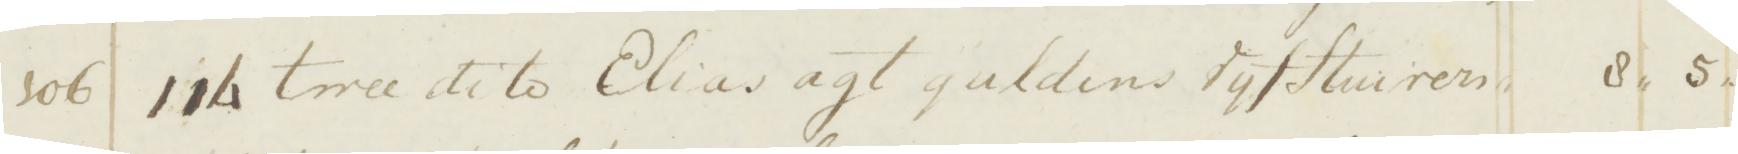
106 114 twee dito Elias agt guldens Vyf stuivers„ 8„ 5
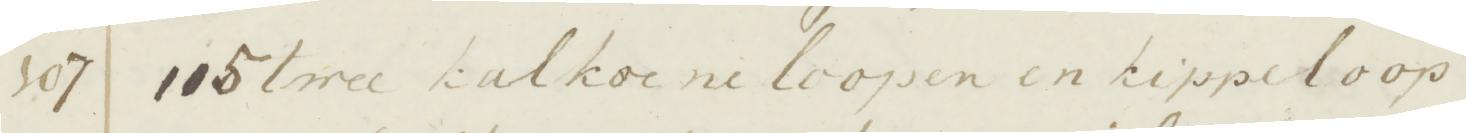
107 115 twee kalkoene loopen en kippeloop
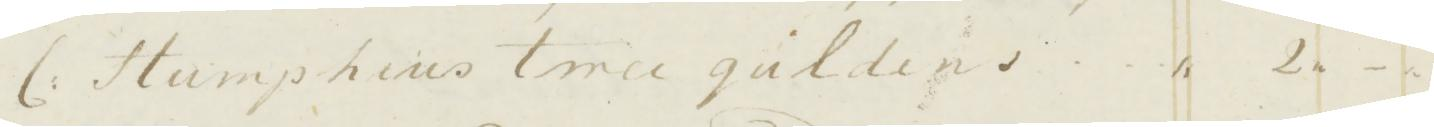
C: Humphius twee guldens . . . „ 2„ -„
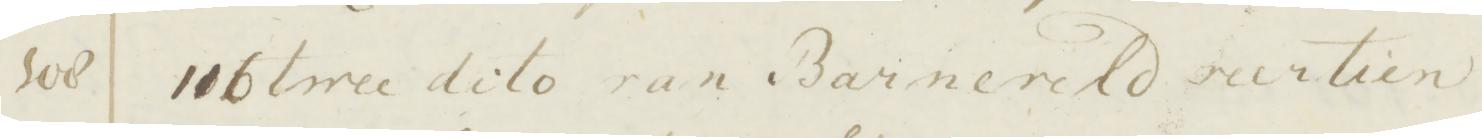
108 116 twee dito van Barneveld veertien
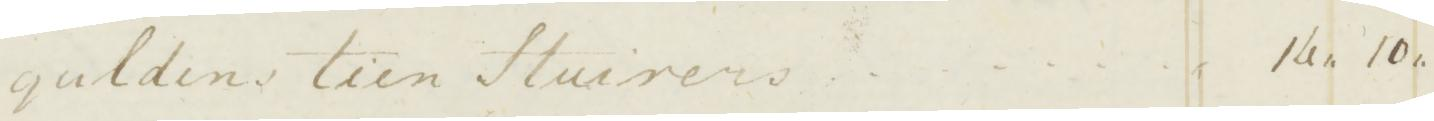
guldens tien stuivers . . . . . . . „ 14„ 10„
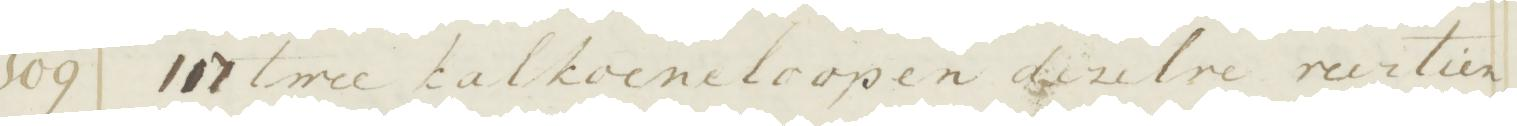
109 117 twee kalkoeneloopen dezelve veertien
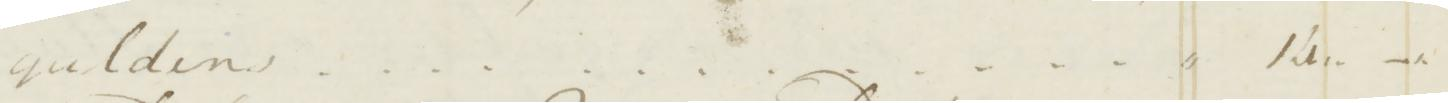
guldens . . . . . . . . . . . . . „ 14„ _„
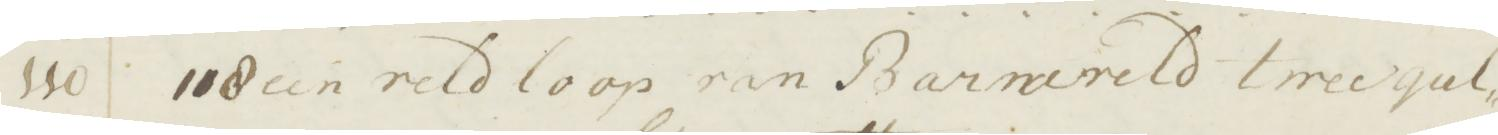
110 118 een veld loop van Barneveld twee gul
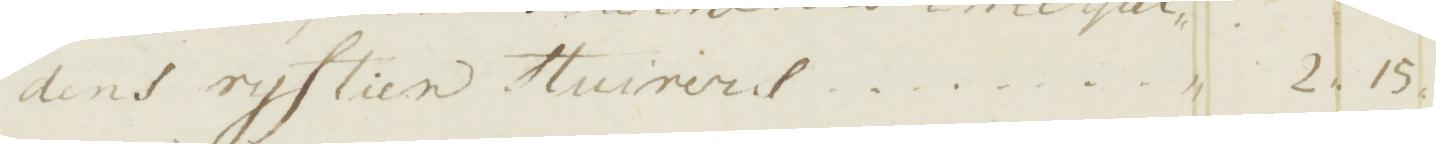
dens vyftien stuivers . . . . . . . . „ 2„ 15„
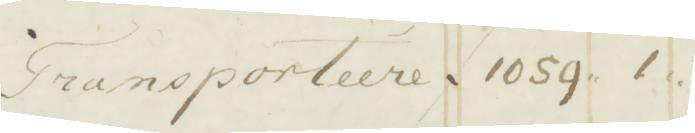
Transporteere ƒ 1059„ 1„
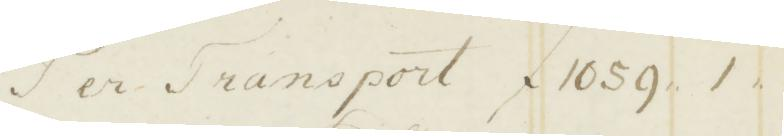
Per Transport ƒ1059„ 1„
